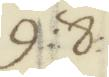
9: 8
